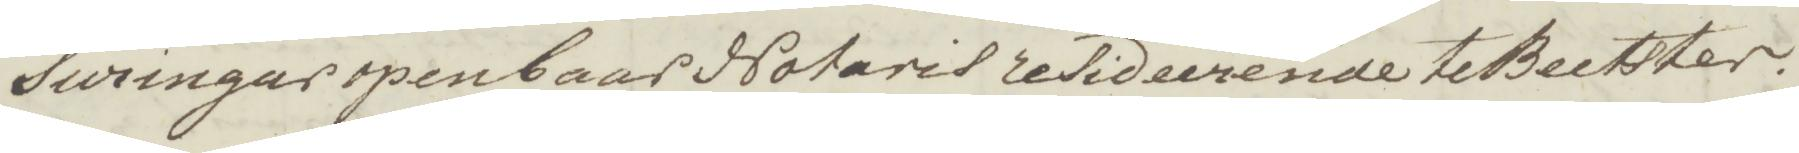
Suringar openbaar Notaris resideerende te Beetster.
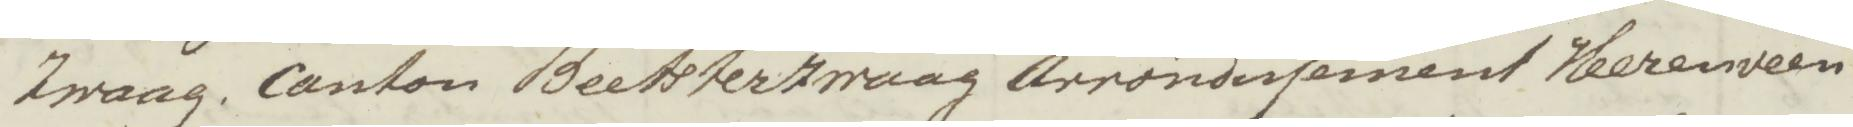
Zwaag, Canton Beetsterzwaag Arrondissement Heerenveen
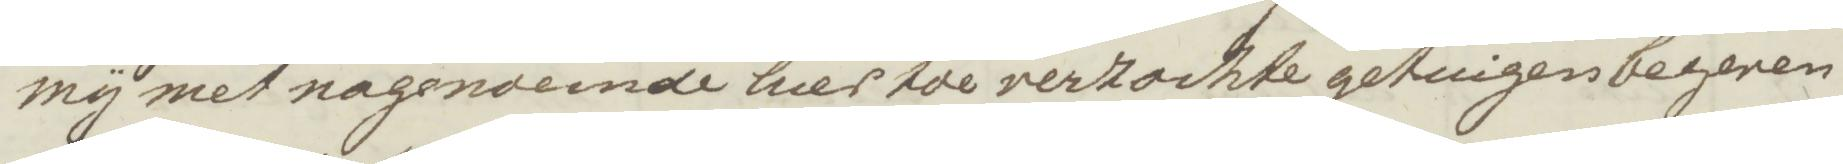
mij met nagenoemde hier toe verzochte getuigen begeven
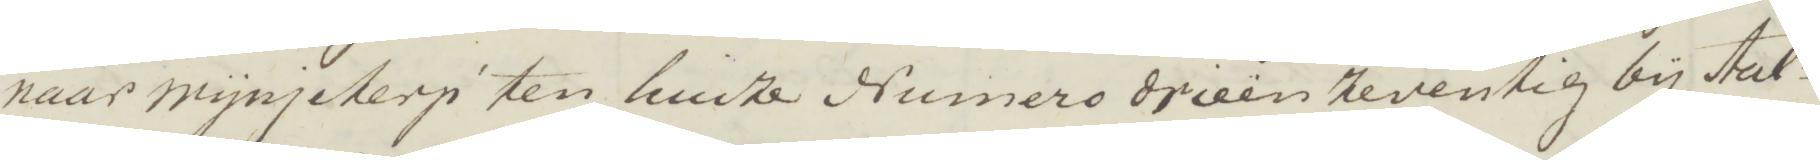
naar wijnjeterp 'ten huize Numero drieen zeventig bij Aal=
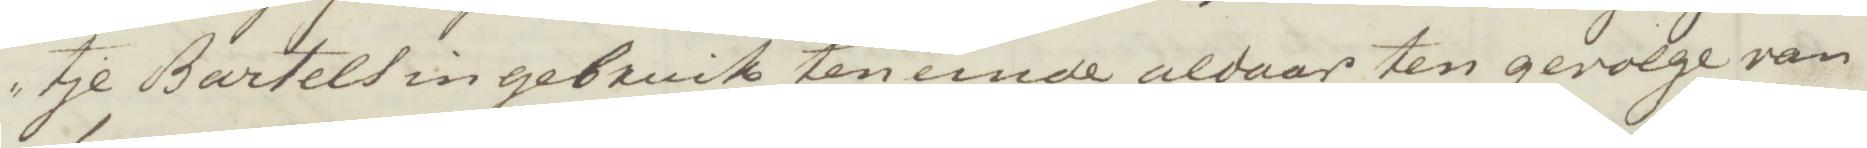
„tje Bartels in gebruik ten einde aldaar ten gevolge van
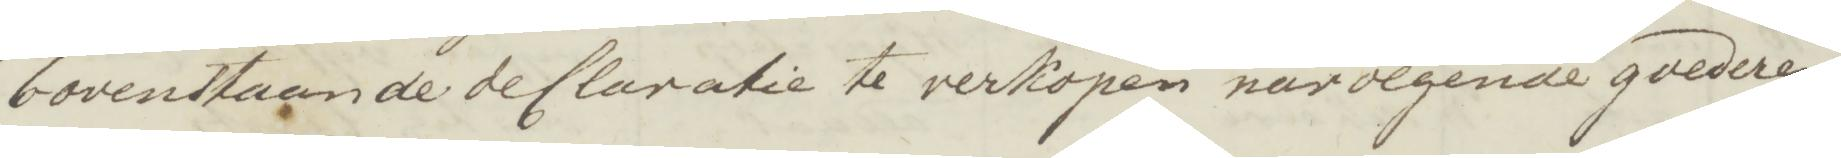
bovenstaande declaratie te verkopen navolgende goederen
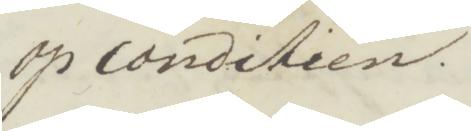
op conditien.
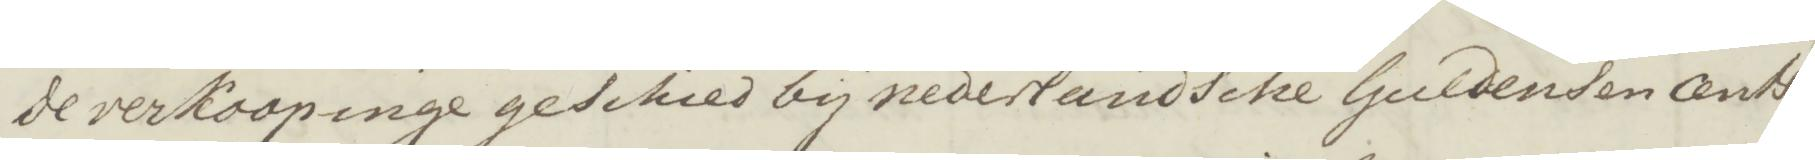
de verkoopinge geschied bij nederlandsche Guldens en cents
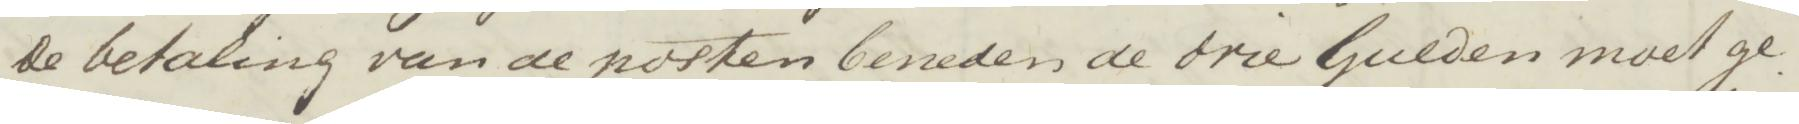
de betaling van de posten beneden de drie Gulden moet ge
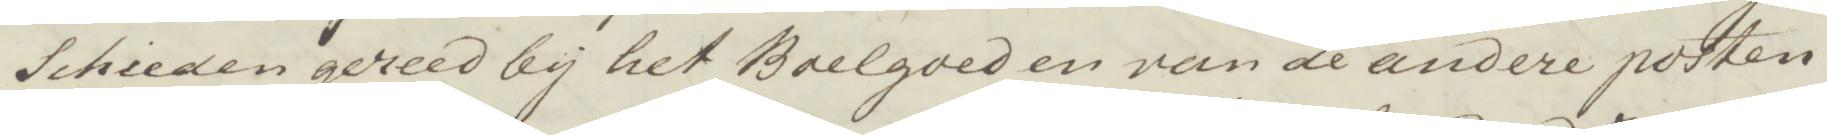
schieden gereed bij het Boelgoed en van de andere posten
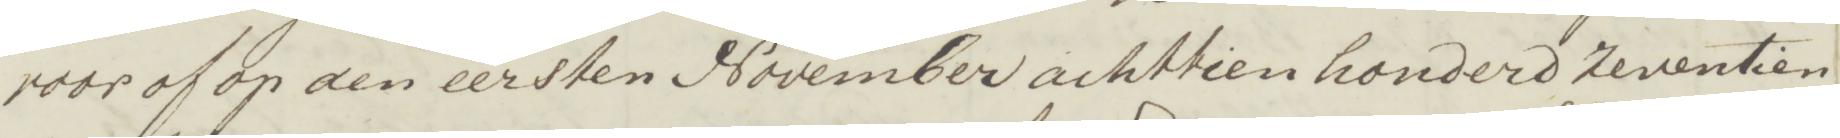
voor of op den eersten November achttien honderd zeventien
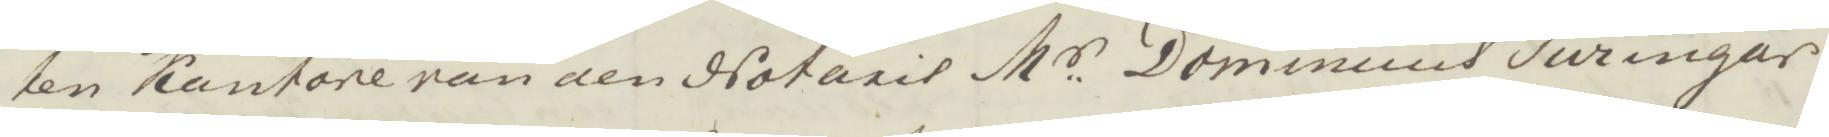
ten Kantore van den Notaris M„r Dominicus Suringar
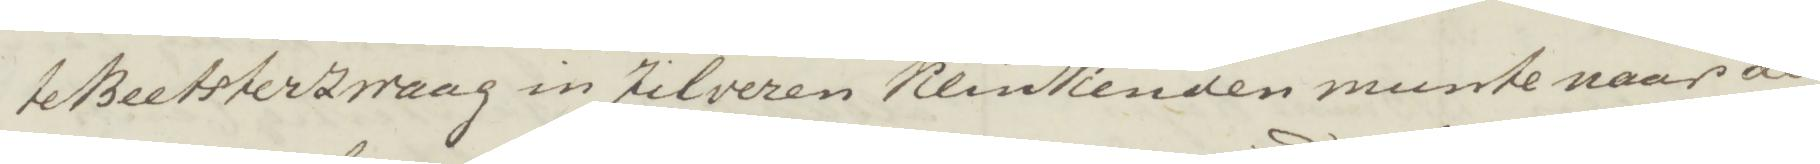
te Beetsterzwaag in Zilveren Klinkenden munte naar de
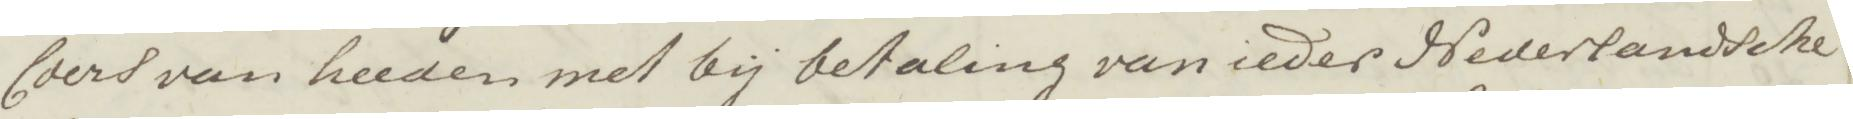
Coers van heeden met bij betaling van ieder Nederlandsche
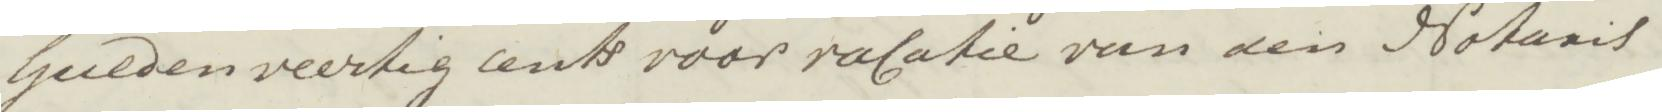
Gulden veertig cents voor vacatie van den Notaris
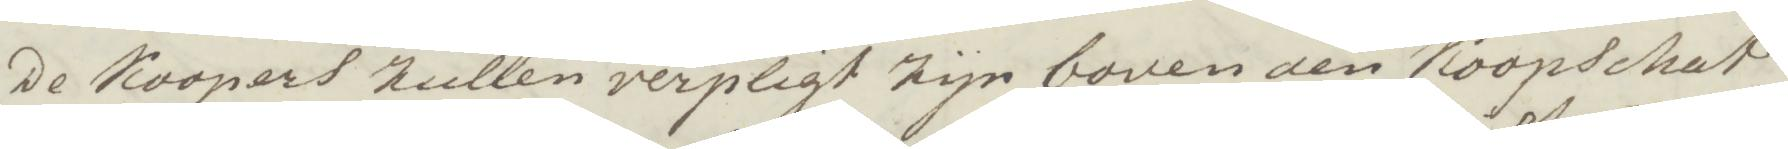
De Koopers zullen verpligt zijn boven den Koopschat
